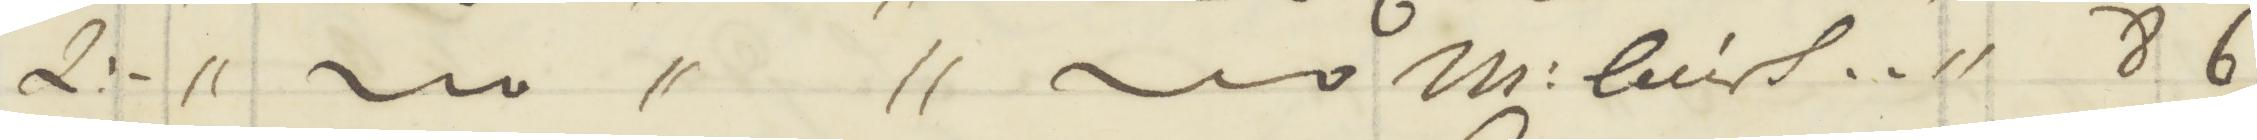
2:- „ _o „ „ _o M: leurs . . „ 8 6
